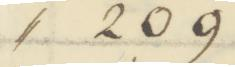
„ 209
